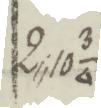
2„10¾
